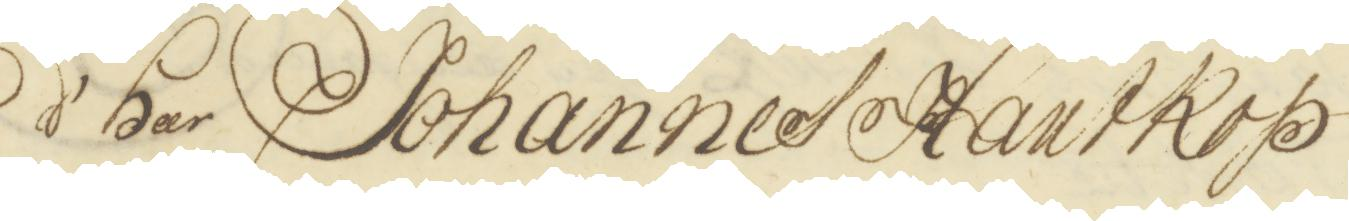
d’ heer Johannes Hartkop
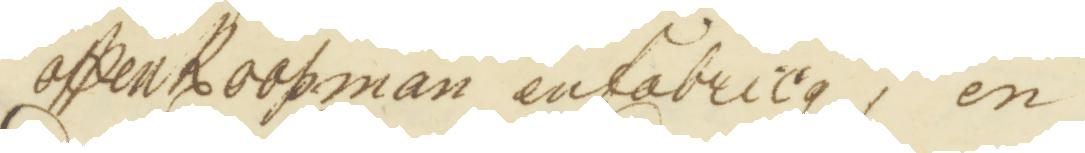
opperkoopman en fabricq, en
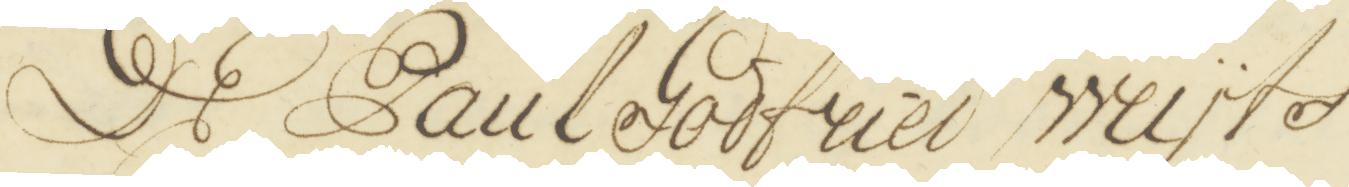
DE Paul Godfried weijts
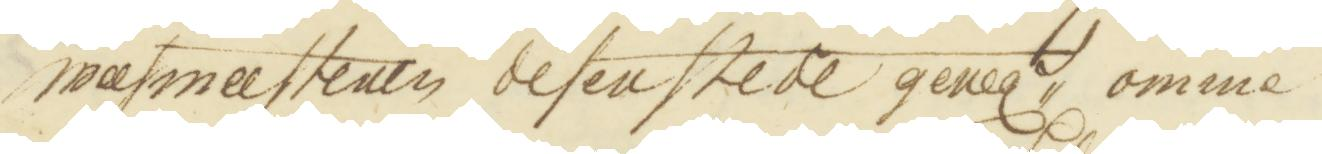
weesmeesteren deser stede gereq„s omme
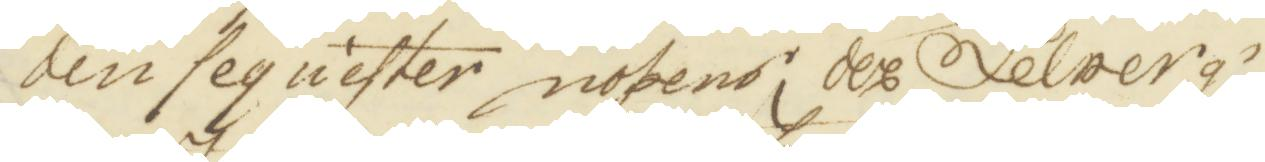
den sequester nopens der selver g'
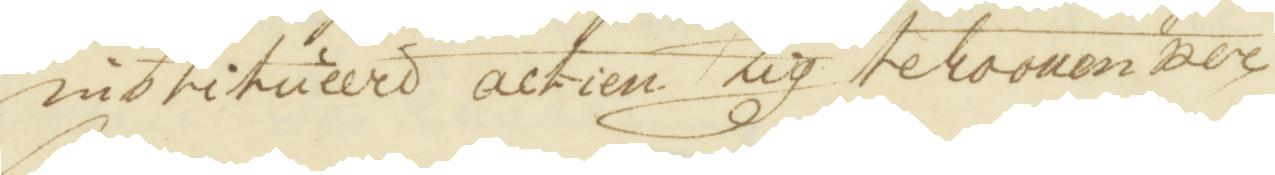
institueerd actien zig te hooren ver
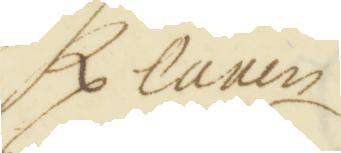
klaren
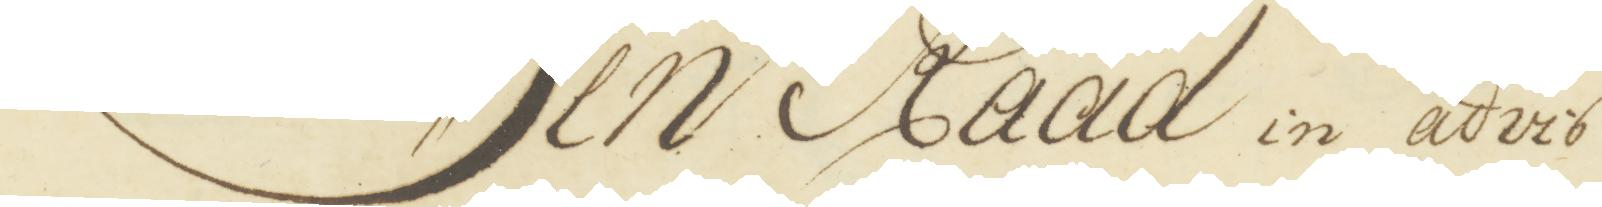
Den Raad in advis
